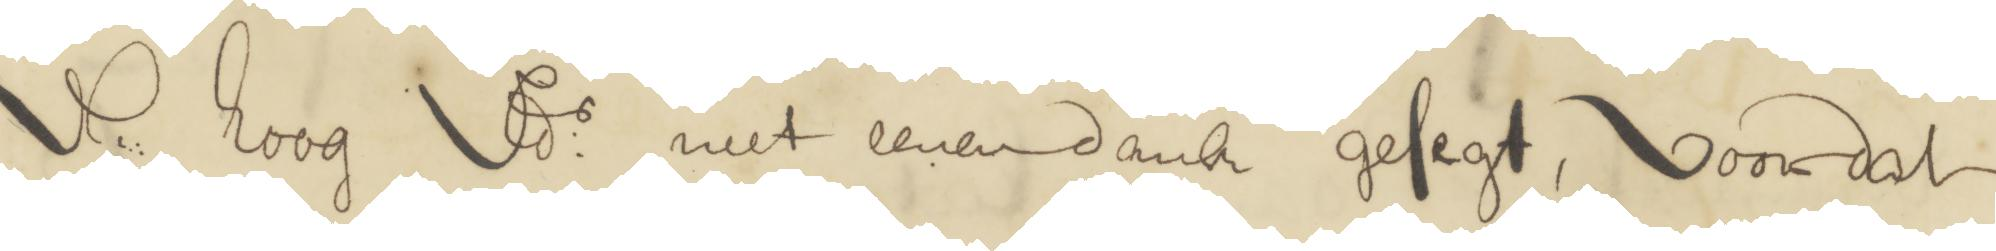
VE: hoog Ed:s met eenen dank gesegt, voor dat
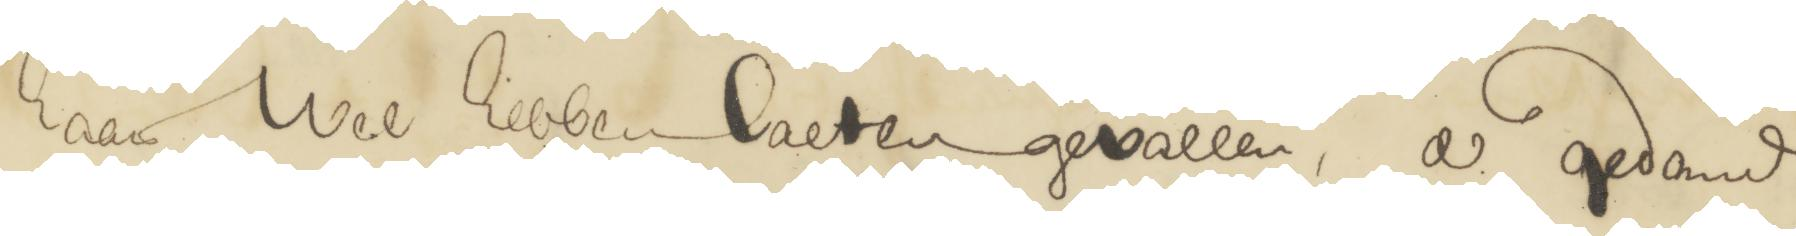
haar wel hebben laeten gevallen, de gedane
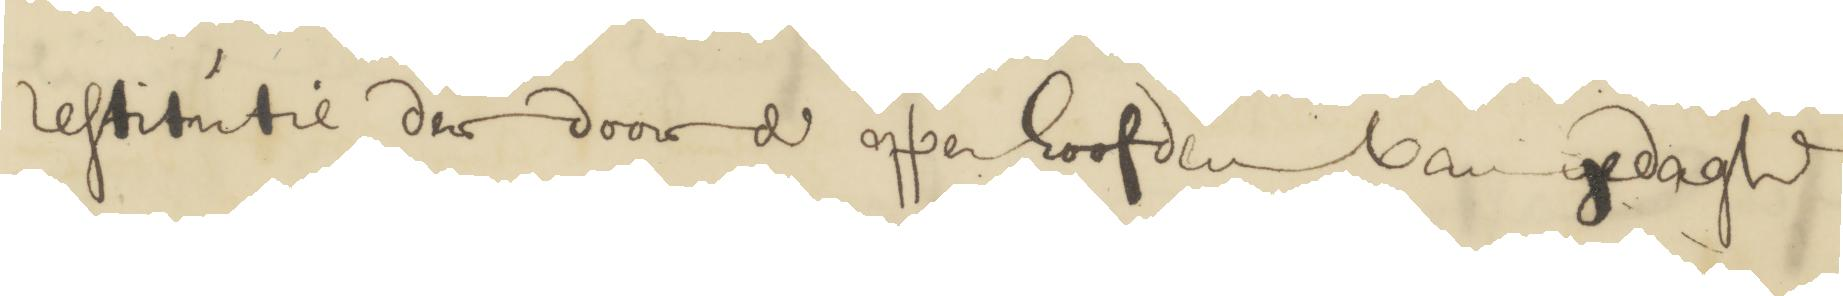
restitutie der door de opperhoofden van gedagte
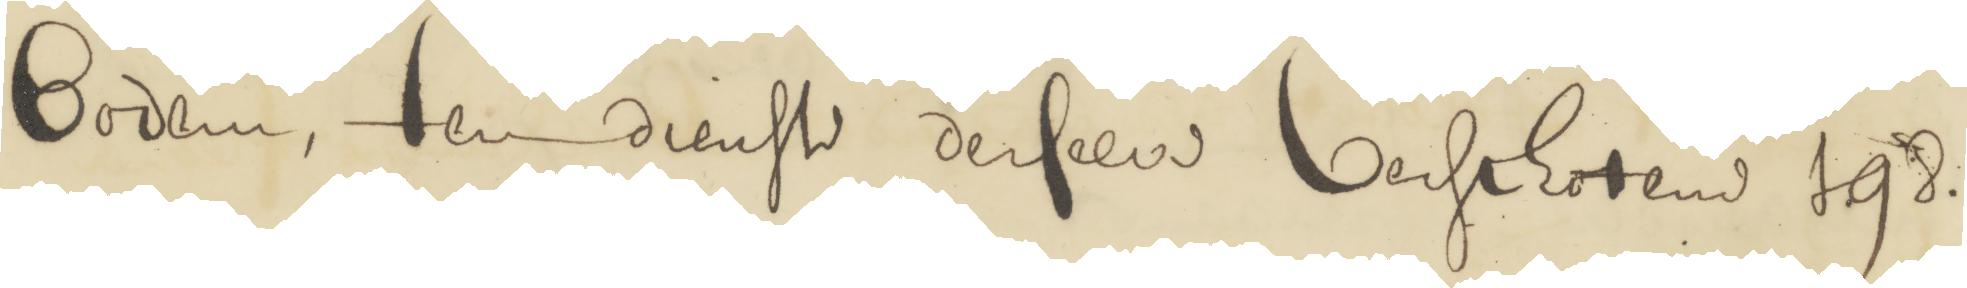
bodem, ten dienste derselve verschotene 198
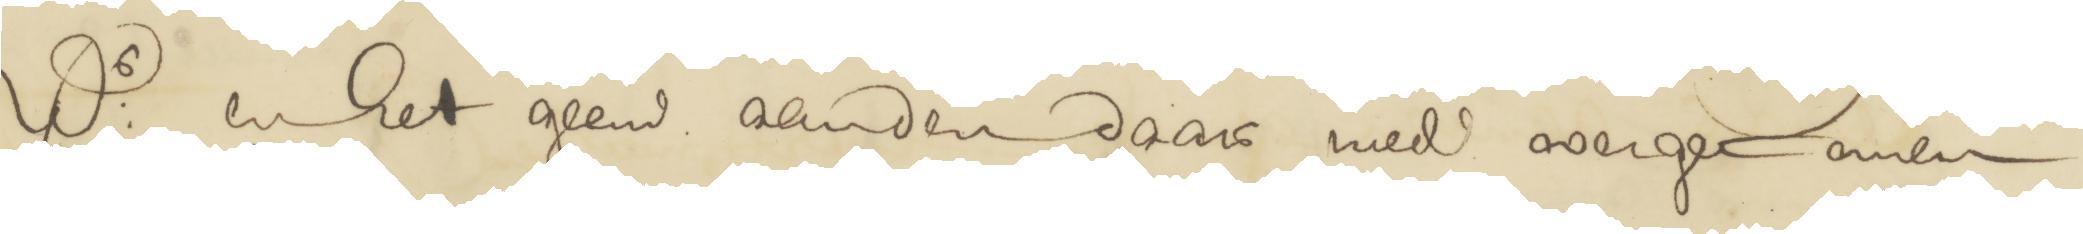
Ed:s en het geene aanden daar mede overgecomen
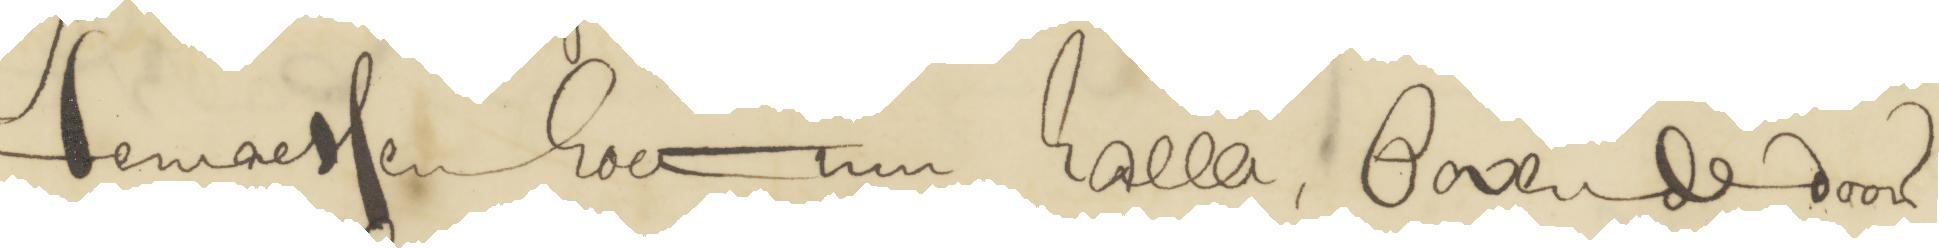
ternaetsen hoecum hallei, boven de door
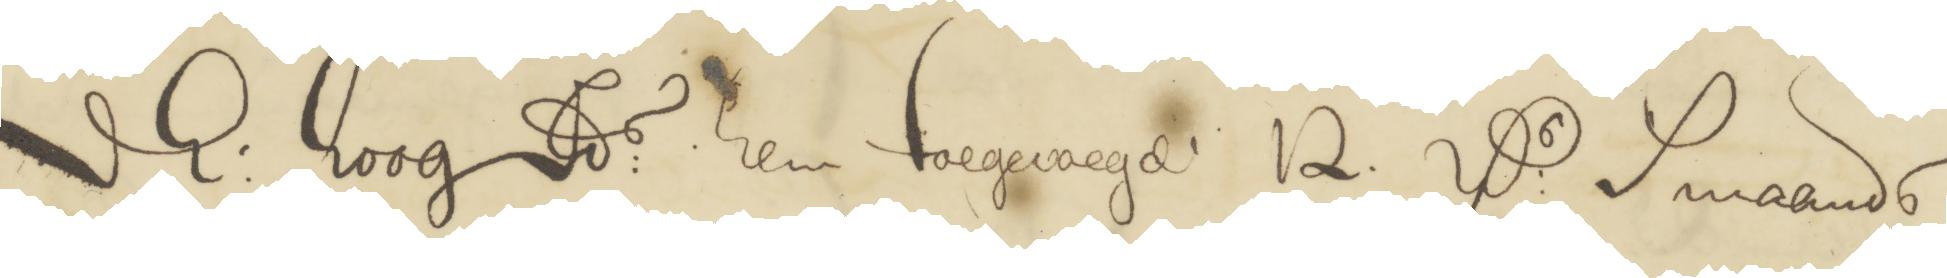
UE: hoog Ed:s hem toegevoegd 12. p:s Smaands
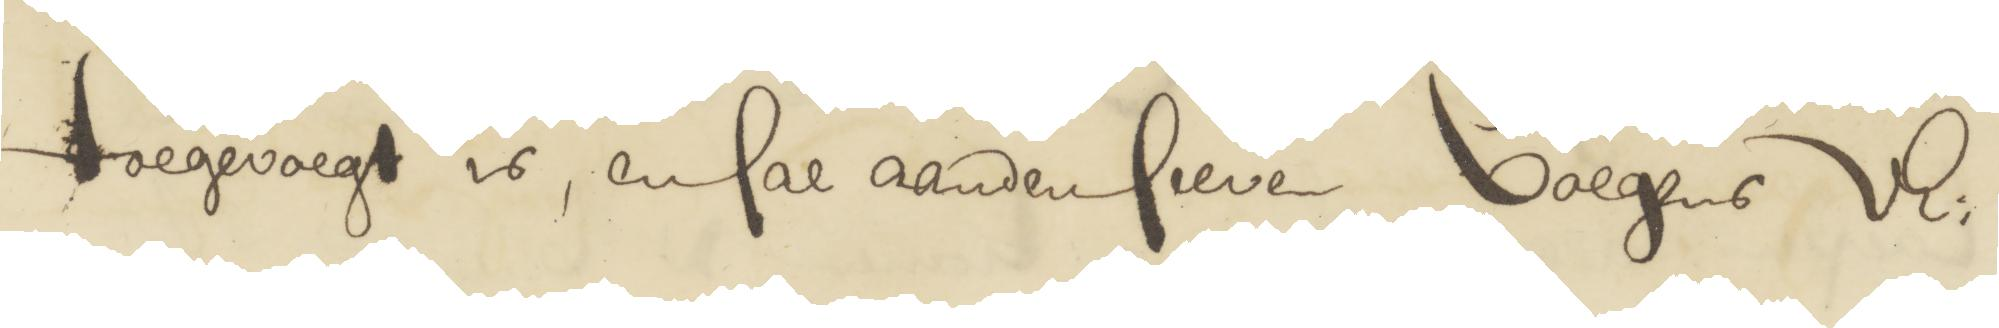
toegevoegt is, en sal aan denselve volgens VE:
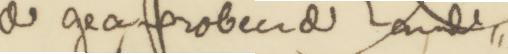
de geapprobeerde hande„,
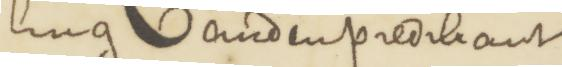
ling van den predikant
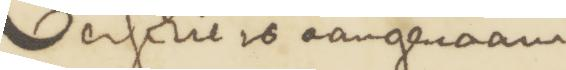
verschie is aangenaam
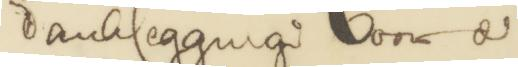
dank segging voor de
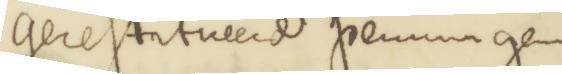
gerestitueerde penningen
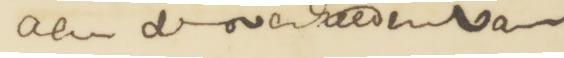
aen de overheeden van
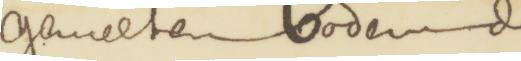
gemelten bodem de
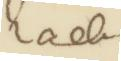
halk
